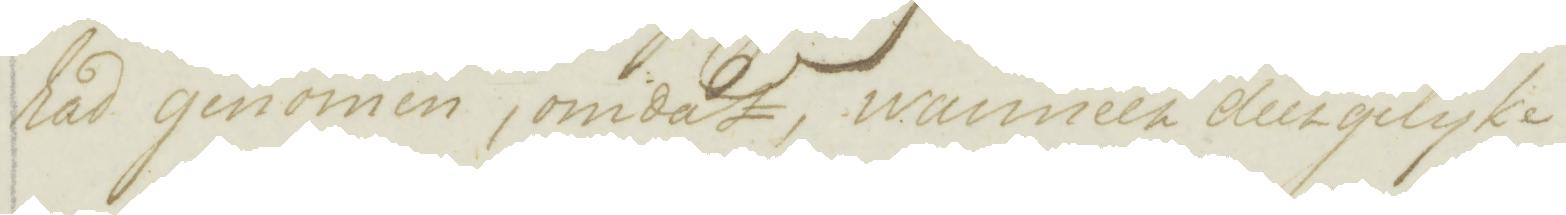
had genomen, omdat, wanneer deergelyke
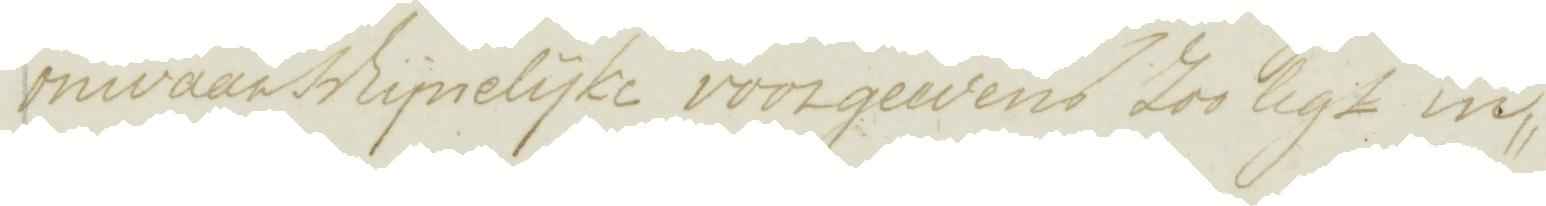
onwaarschijnelijke voorgeevens Zoo ligt in„
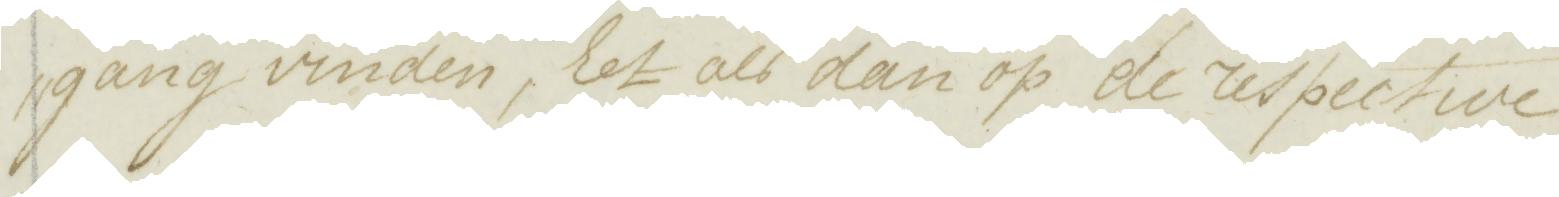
„gang vinden, het als dan op de respective
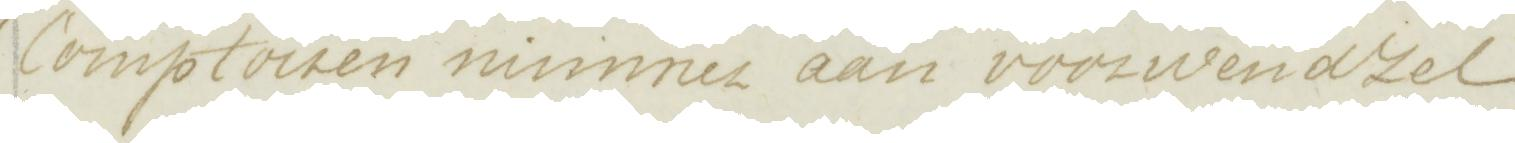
Comptoiren nimmer aan voorwendzel
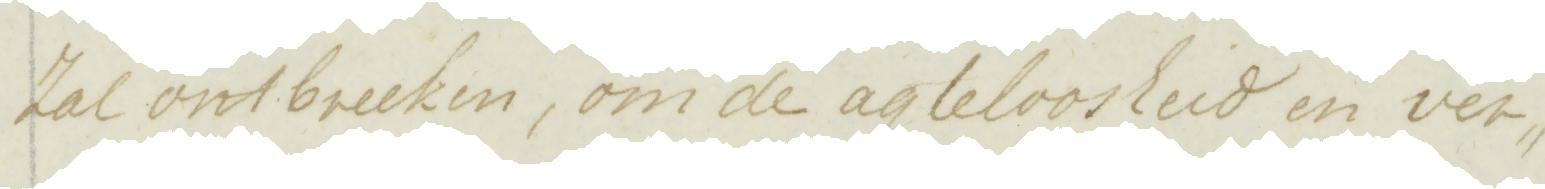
Zal ontbreeken, om de agteloosheid en ver„
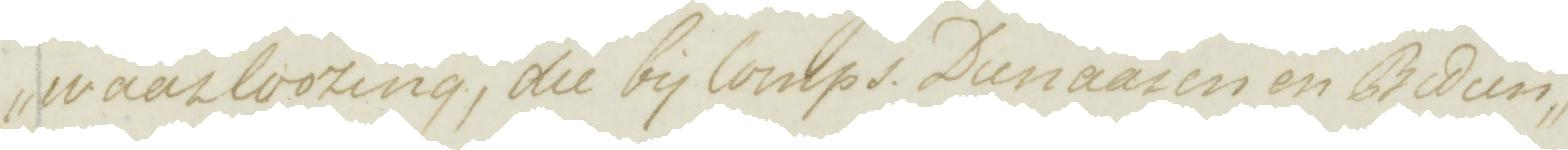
„waarloozing, die bij Comps. Dienaaren en Bedien,
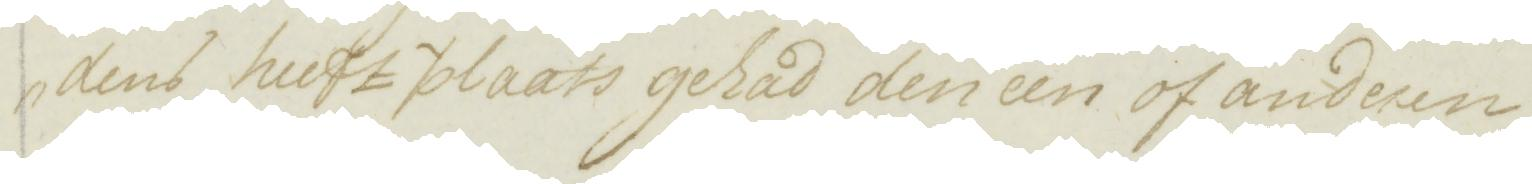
„dens heeft plaats gehad den een of anderen
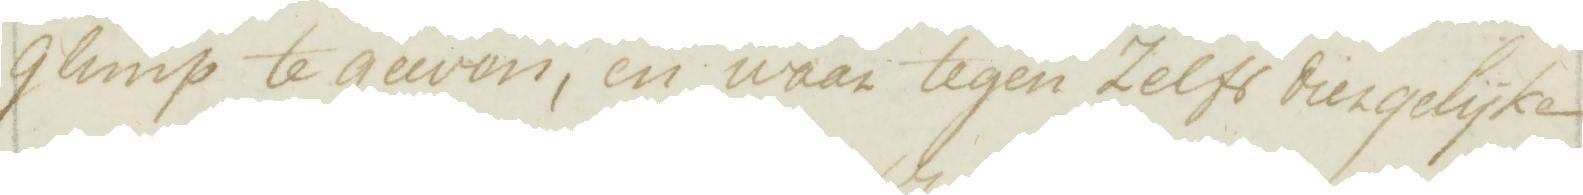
glimp te geeven, en waar tegen Zelfs diergelijke
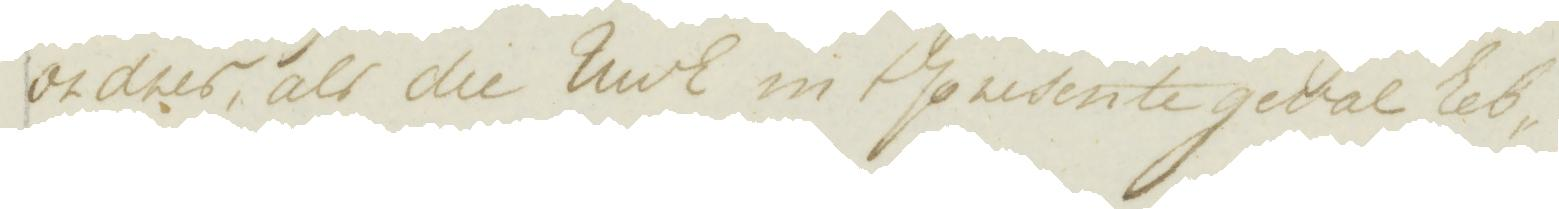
ordres, als die Uwe in t presente geval heb„
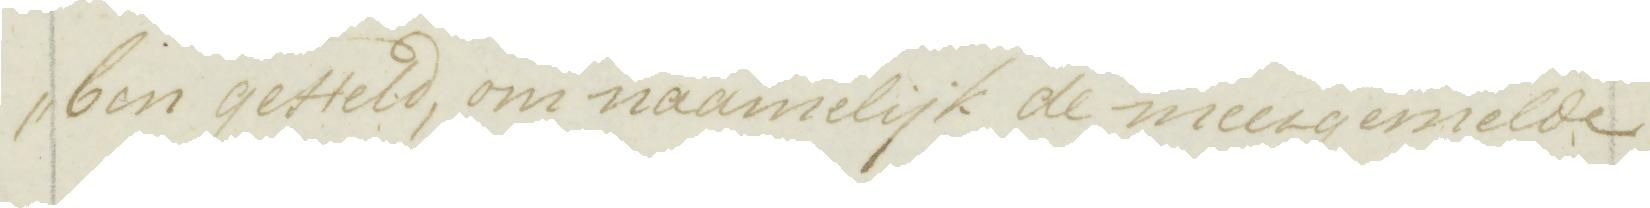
„ ben gesteld, om naamelijk de meergemelde
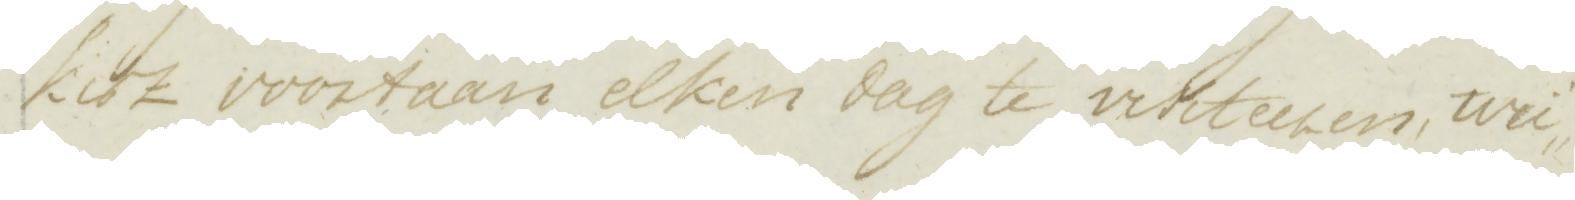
kist voortaan elken dag te visiteeren wei„
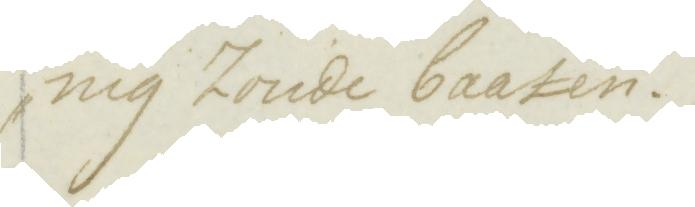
„ nig Zoude baaten.
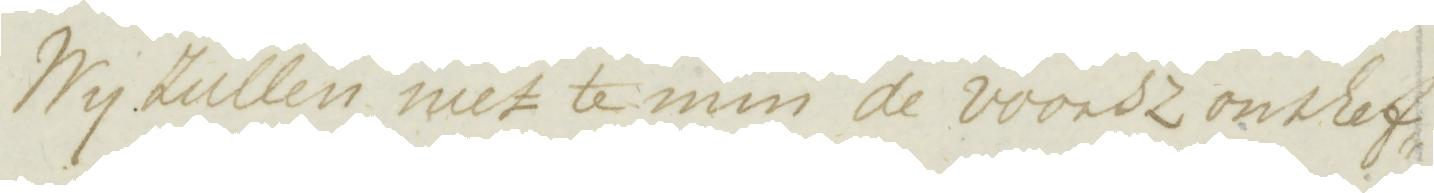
Wy zullen niet te min de voorsz onthef„
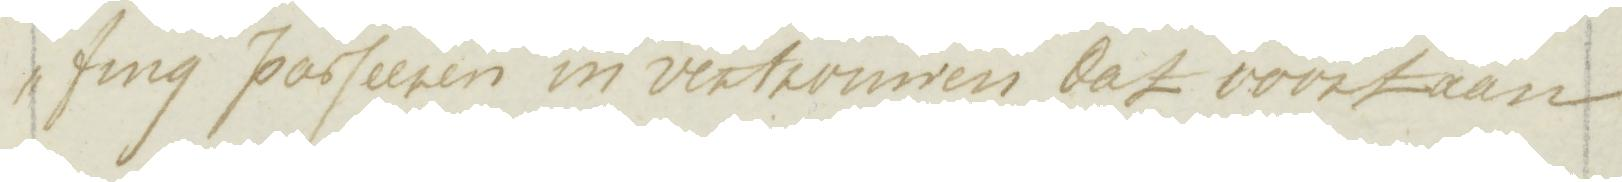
„ fing passeeren in vertrouwen dat voortaan
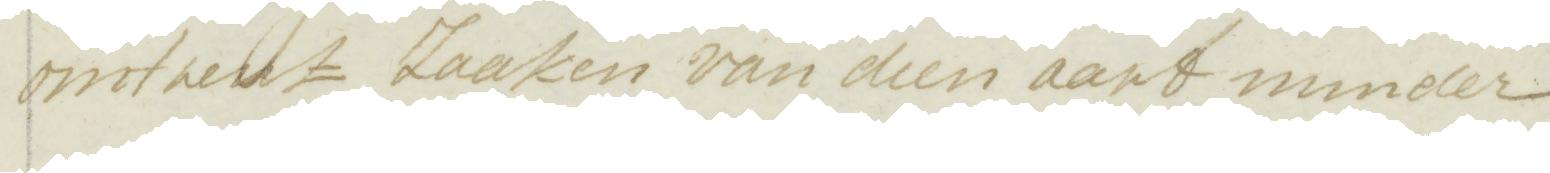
omtrent Zaaken van dien aart minder
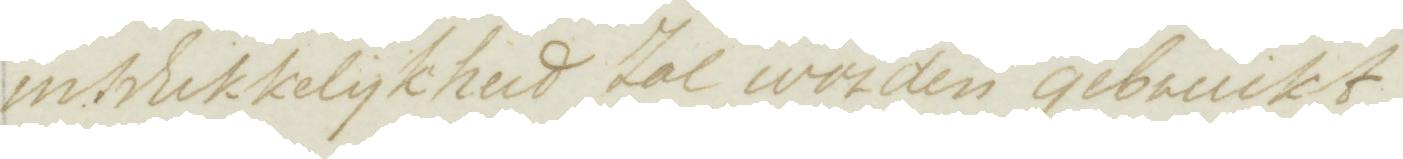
inschikkelijkheid Zal worden gebruikt
